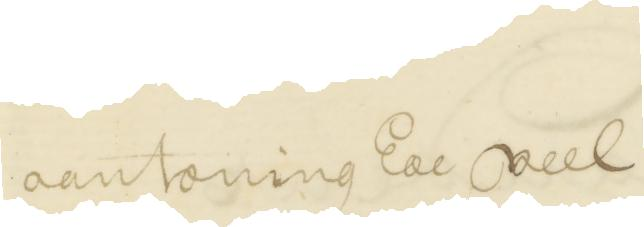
aantoning hoe veel
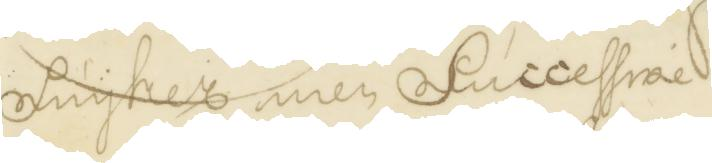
Suijker men Successive
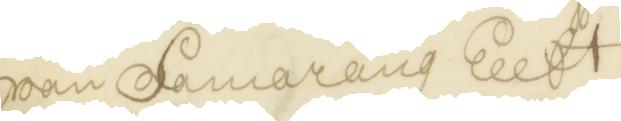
van Samarang heeft
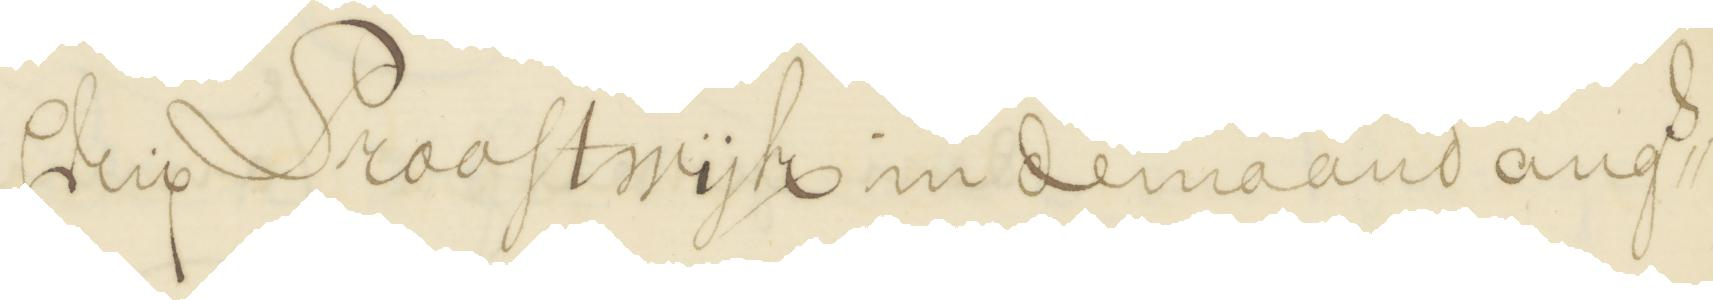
schip Troostwijk in demaand aug„s
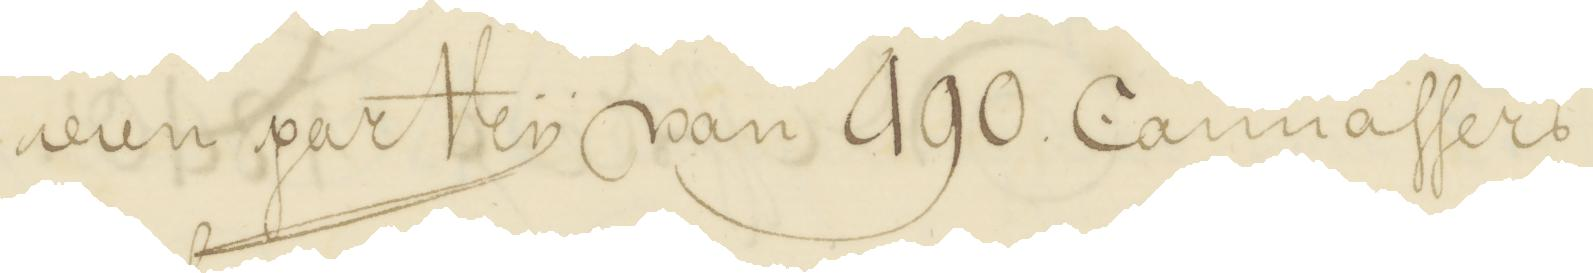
een partheij van 490. Cannassers
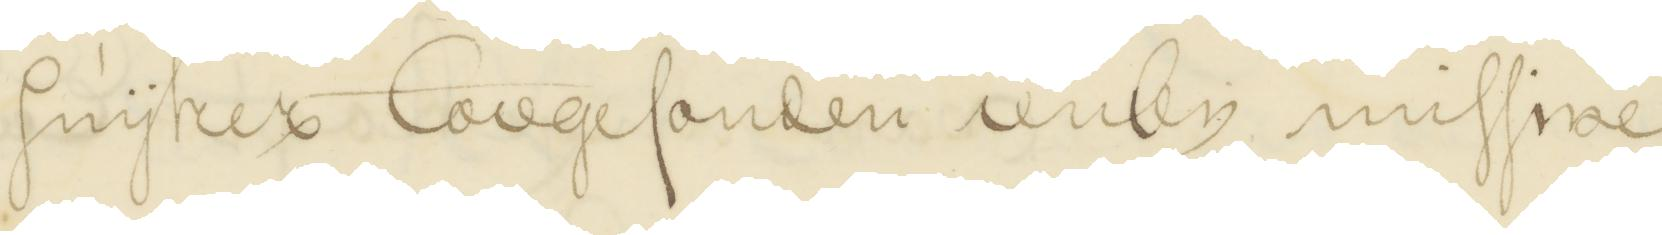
suijker toegesonden enbij missive
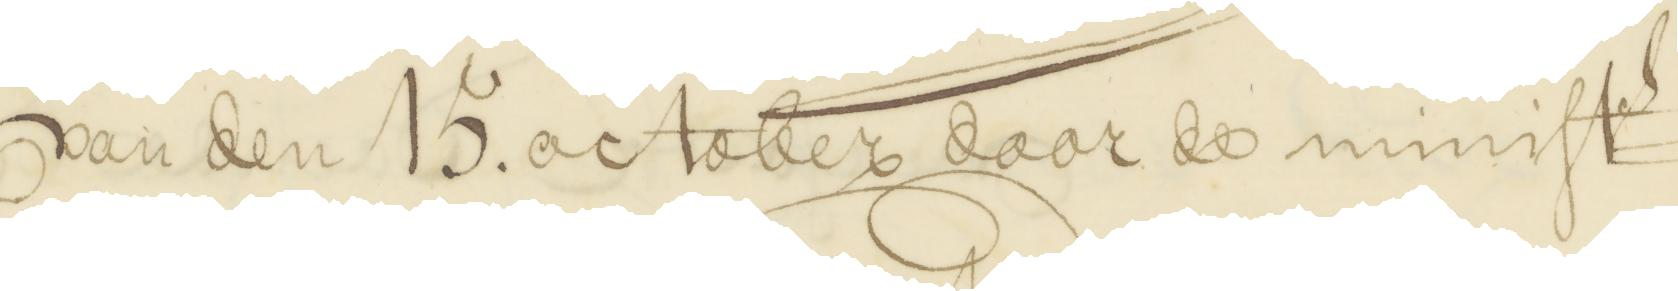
van den 15. october door de minist=s
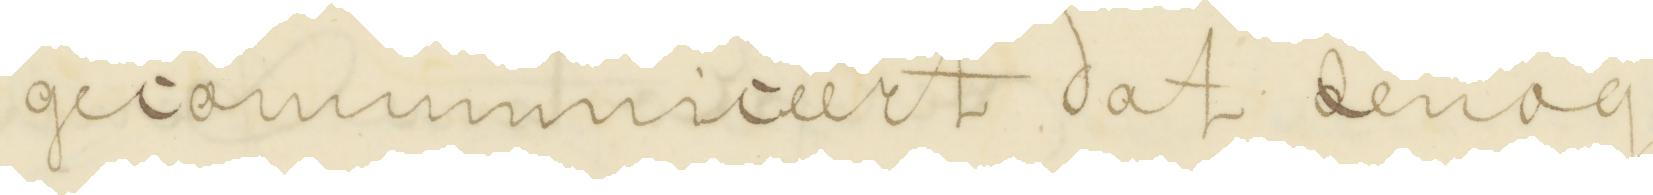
gecommuniceert dat denog
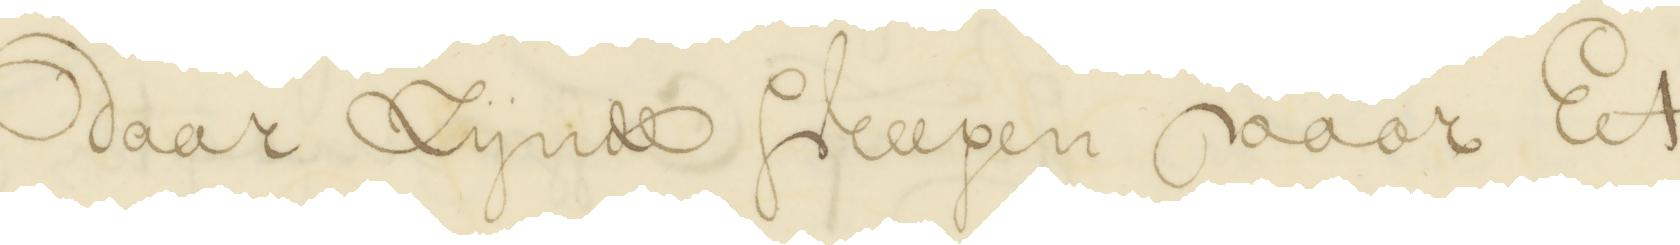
daar zijnde scheepen voor het
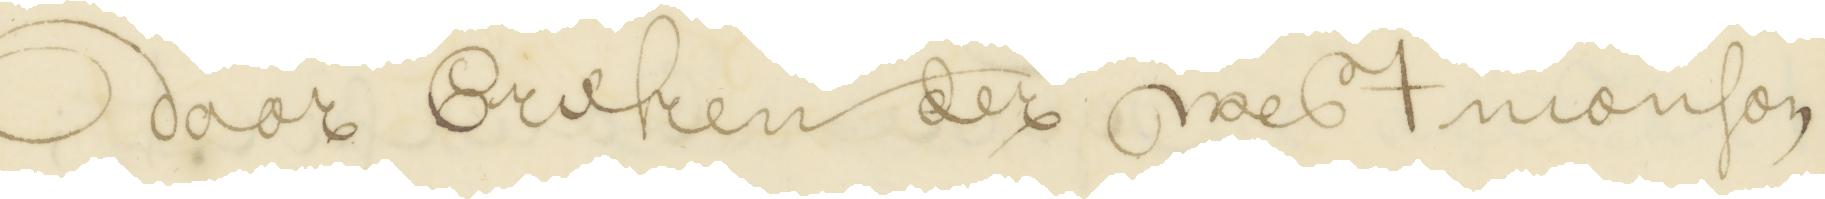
door breken der west mouson
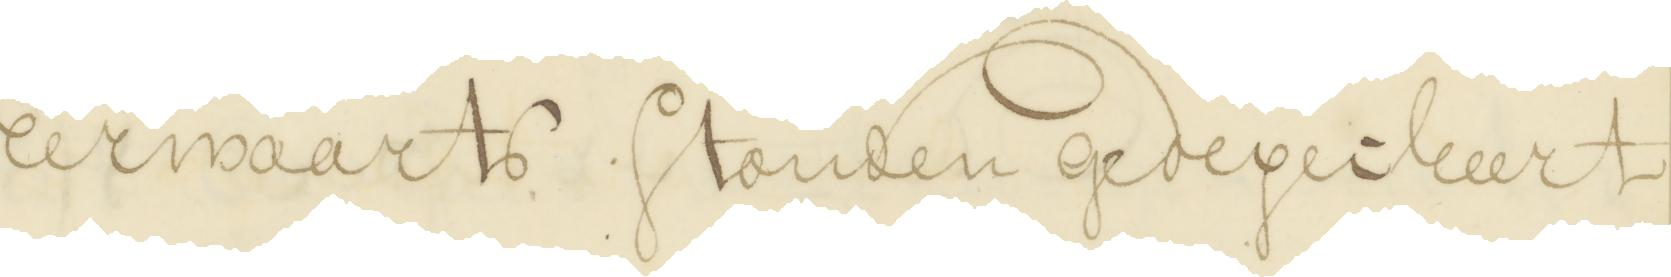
herwaarts stonden gedepecheert
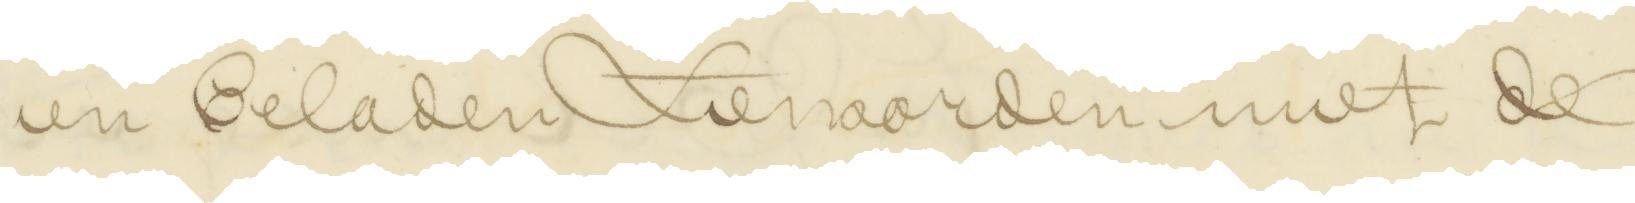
en beladen teworden met de
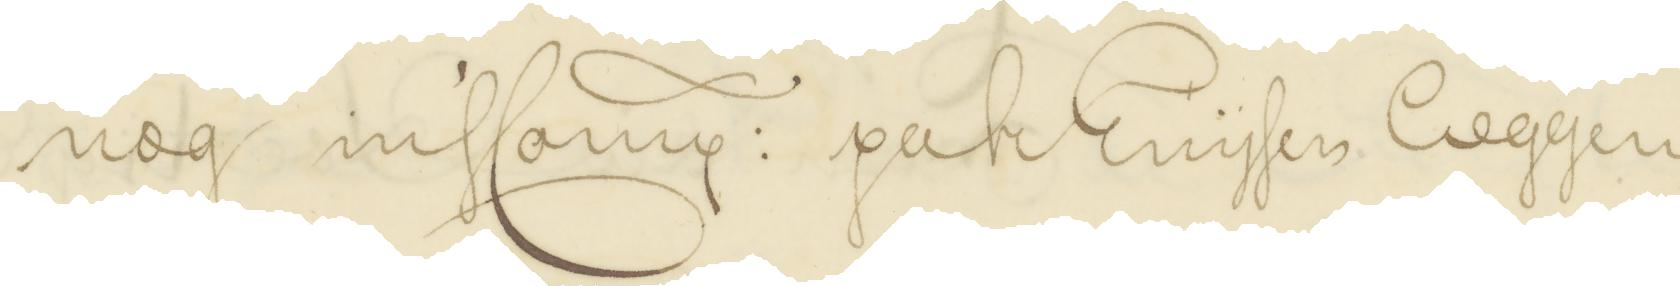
nog ins Comp: pakhuijsen leggen
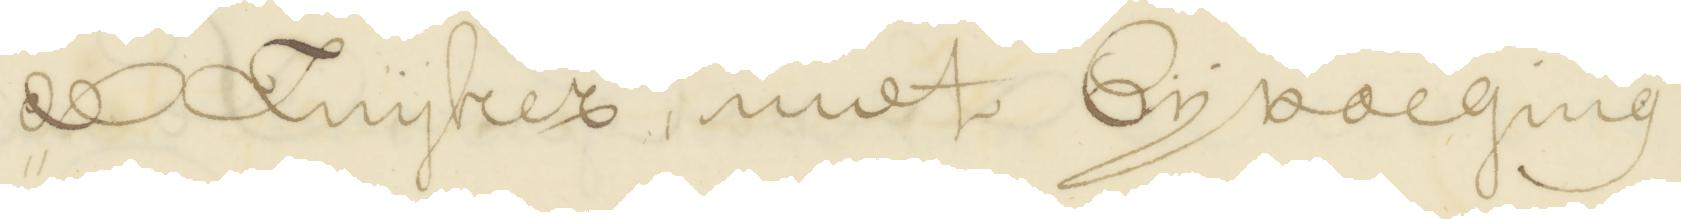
de Zuijker, met bijvoeging
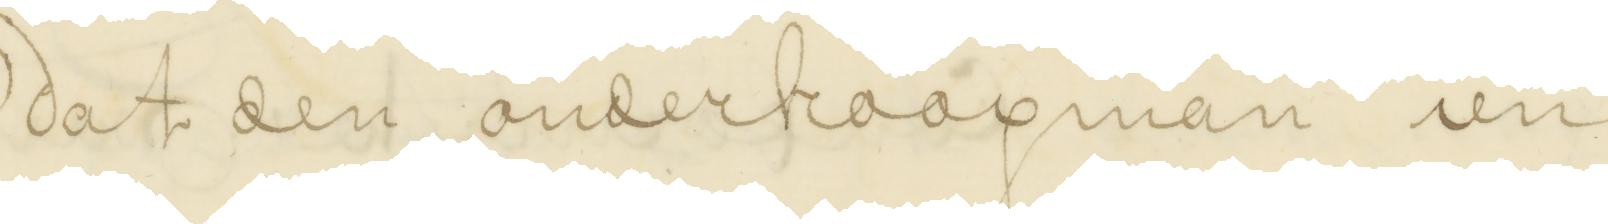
dat den onderkoopman en
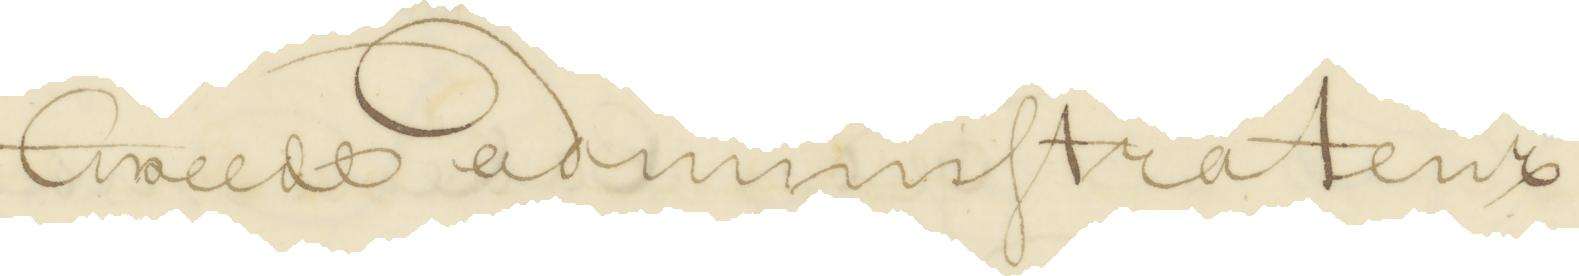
tweede administrateur
